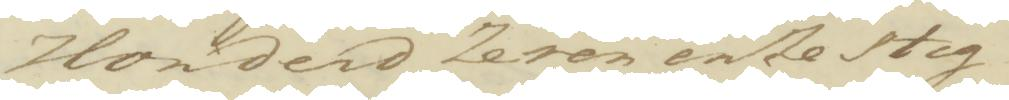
Honderd Zeven en Zestig
